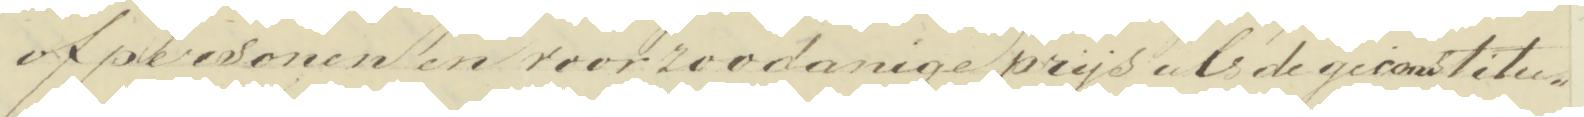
of personen en voor zoodanige prijs als de geconstitu„
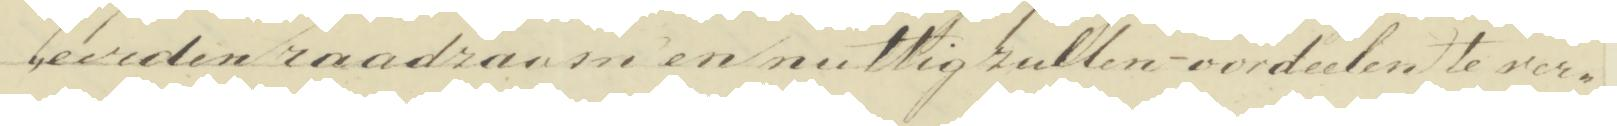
eerden raadzaam en nuttig zullen oordeelen te ver„
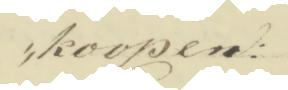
„koopen:
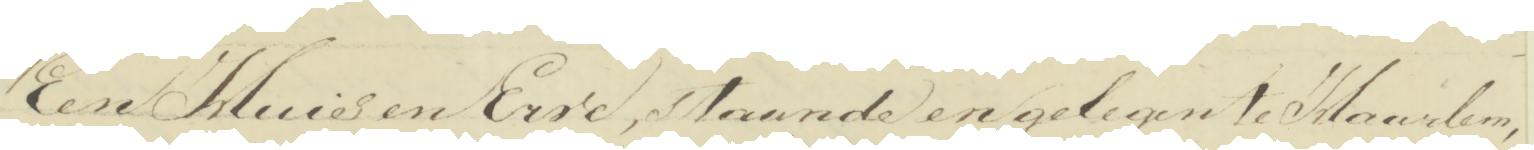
Een Huis en Erve, staande en gelegen te Haarlem,
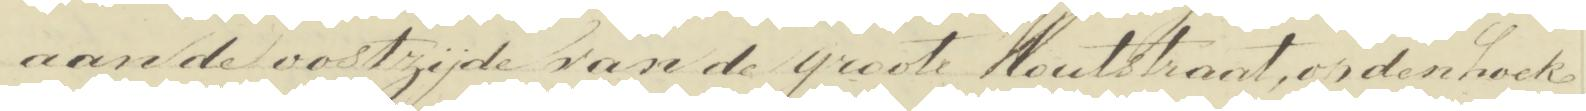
aan de oostzijde van de groote Houtstraat, op den hoek
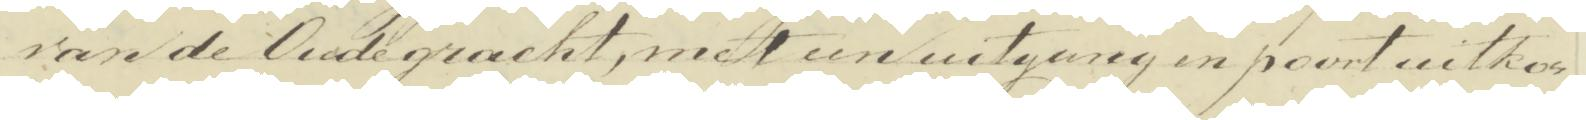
van de Oude gracht, met een uitgang en poort uitko
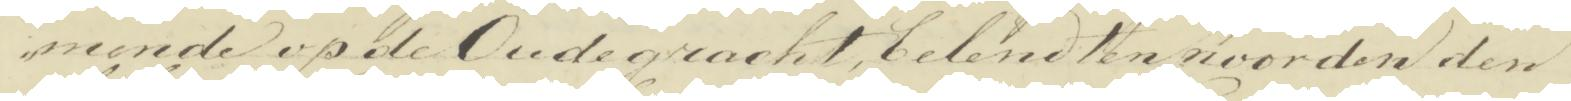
mende op de Oude gracht, belend ten noorden den
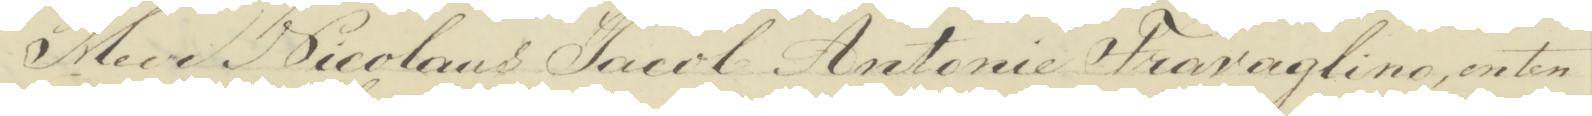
Heer Nicolaas Iacob Antonie Fravaglino, en ten
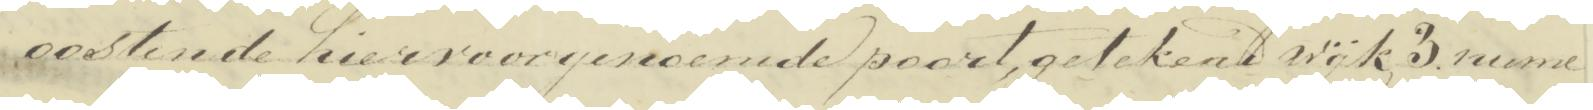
oosten de hiervoor genoemde poort, getekend Wijk 3 nume
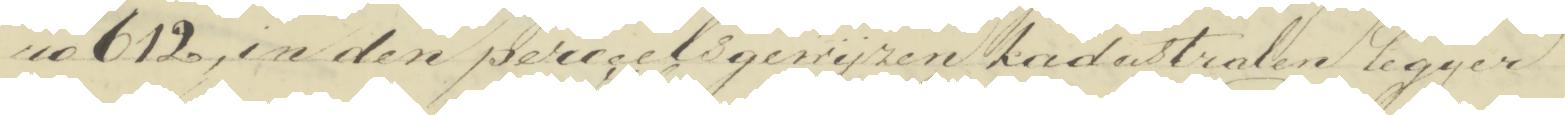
ro 612, in den perceelsgewijzen kadastralen legger
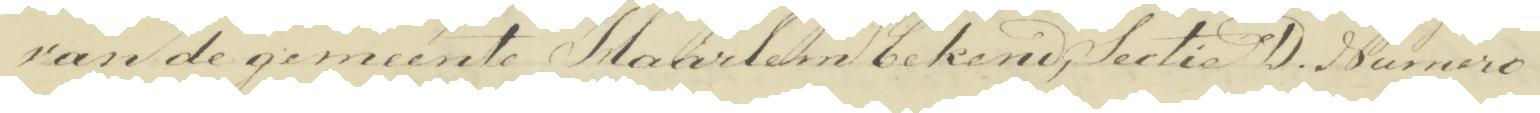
van de gemeente Haarlem bekend, sectie D. Numero
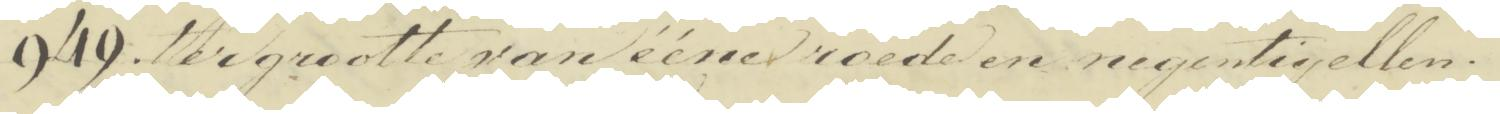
949. ter grootte van ééne roede en negentig ellen.
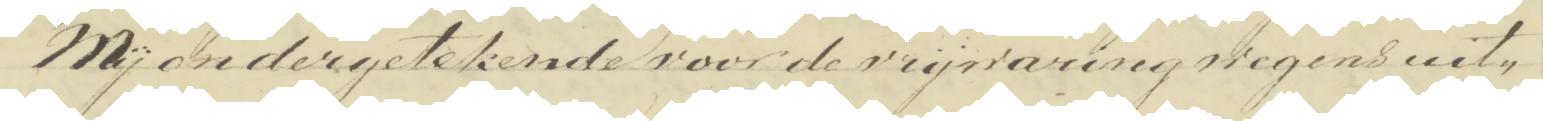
Mij ondergetekende voor de vrijwaring wegens uit„
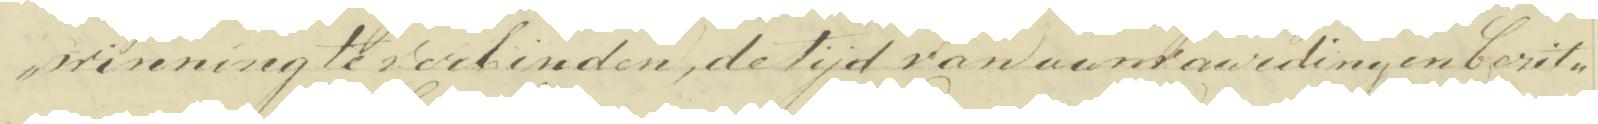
winning te verbinden, de tijd van aanvaarding en bezit
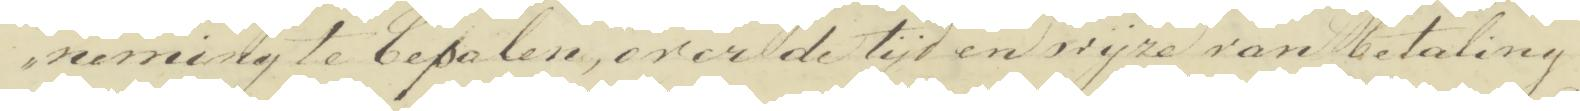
„neming te bepalen, over de tijd en wijze van betaling
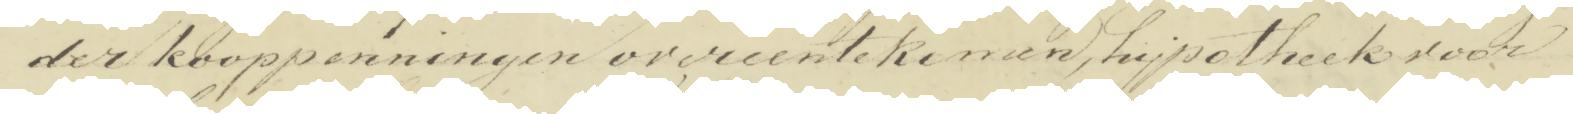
der kooppenningen overeen te komen, hijpotheek voor
